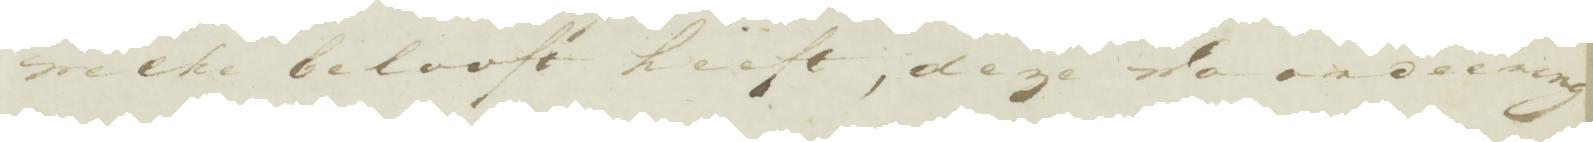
welke belooft heeft, deze na ordeening
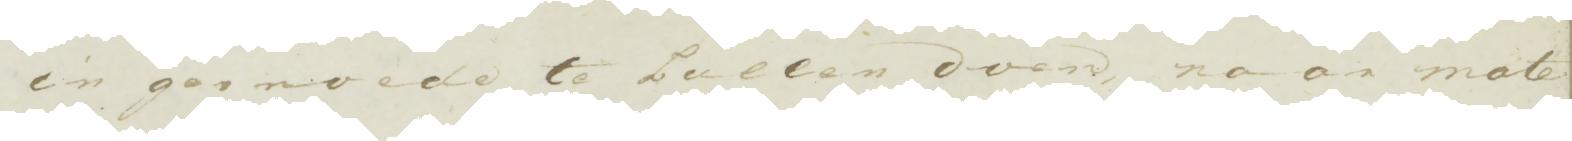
in gemoede te Zullen doen, naar mate
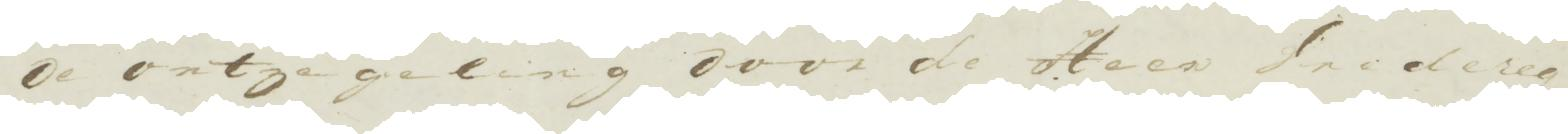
de ontzegeling door de Heer Vredereg
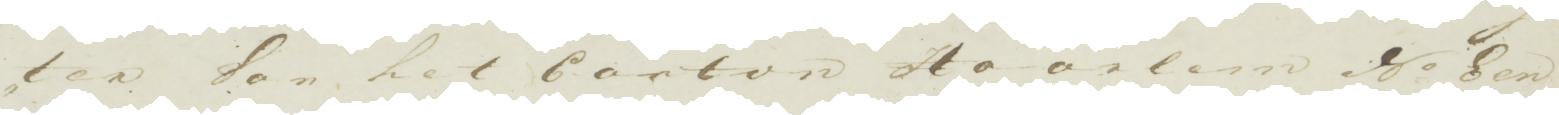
„ter Van het Canton Haarlem N:o Een,
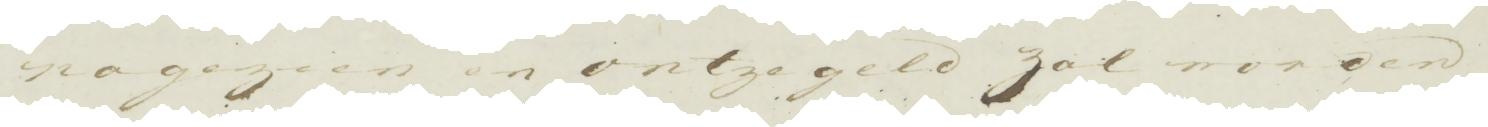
nagezien en ontzegeld zal worden
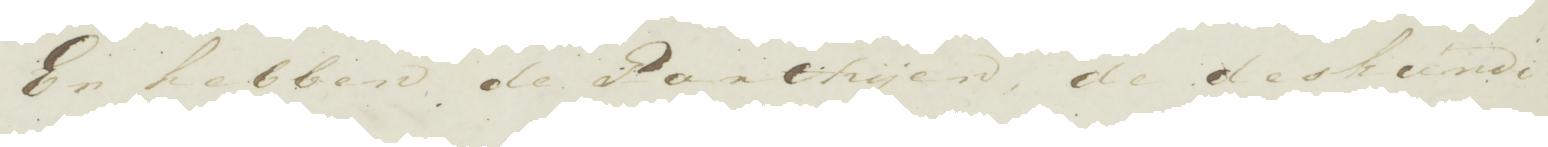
En hebben, de Parthijen, de deskundi
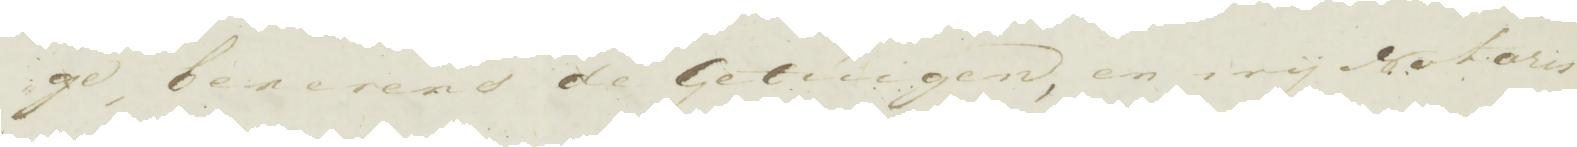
„ge, benevens de Getuigen, en mij Notaris
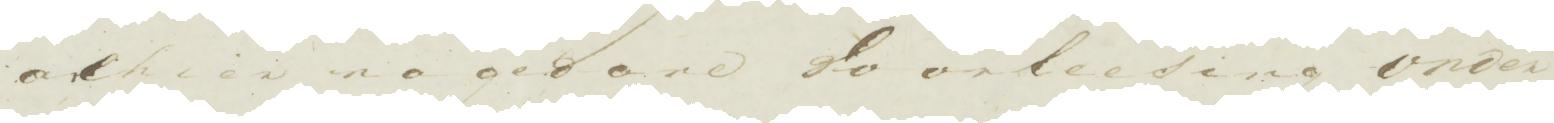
alhier na gedane Voorleesing onder
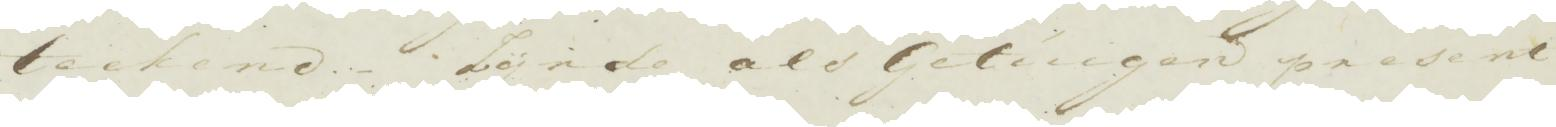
teekend zijnde als Getuigen present
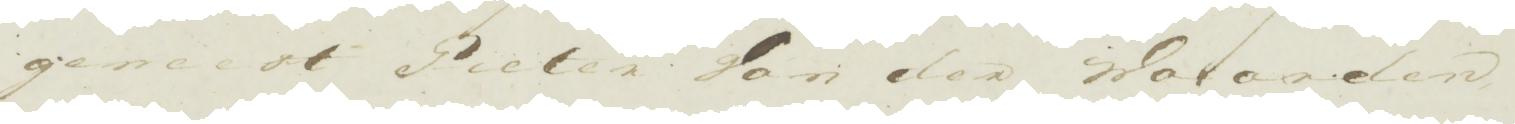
geweest Pieter van der Waarden
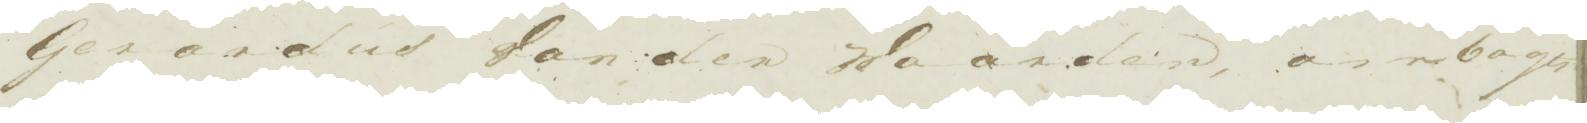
Gerardus van der Waarden, ambagts
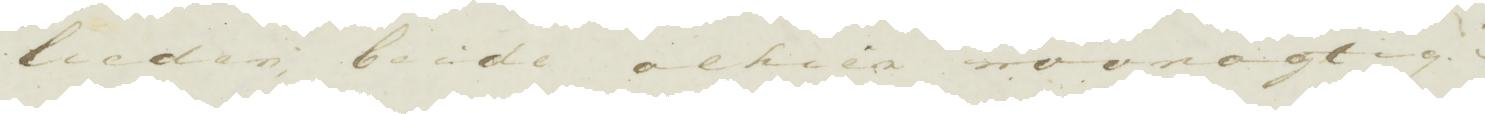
lieden beide alhier woonagtig
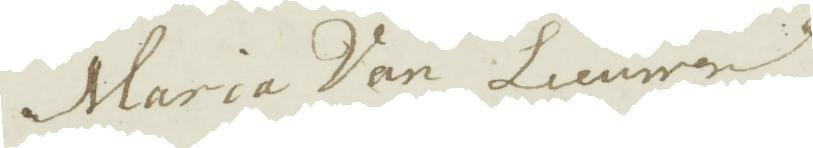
Maria Van Leeuwen
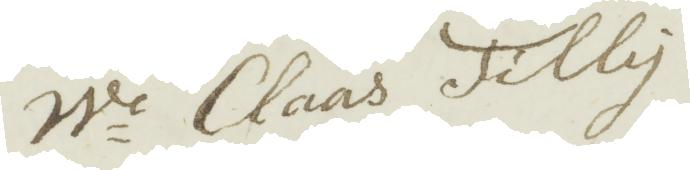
W=e Claas Tillij
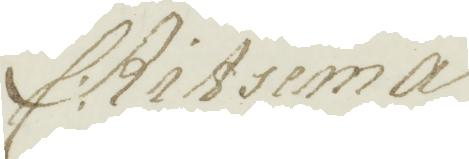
C:Ritsema
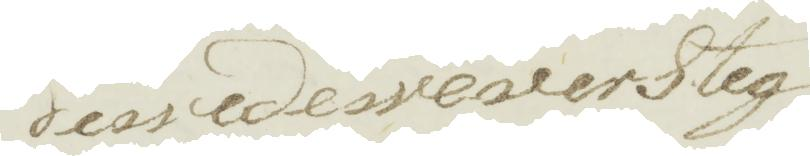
dewedewe versteg
